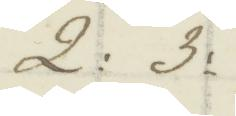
2: 3:
